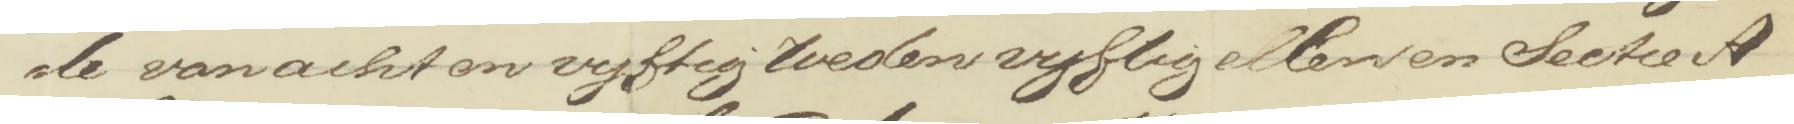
„te van acht en vyftig roeden vyftig ellen en Sectie A
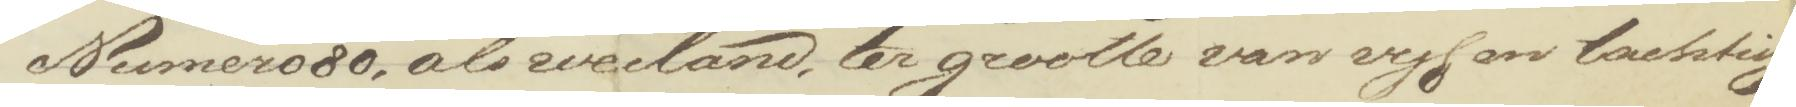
Numero 80, als weiland, ter grootte van vyf en tachtig
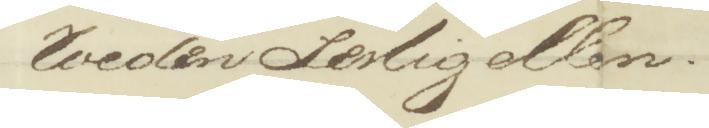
roeden zestig ellen.
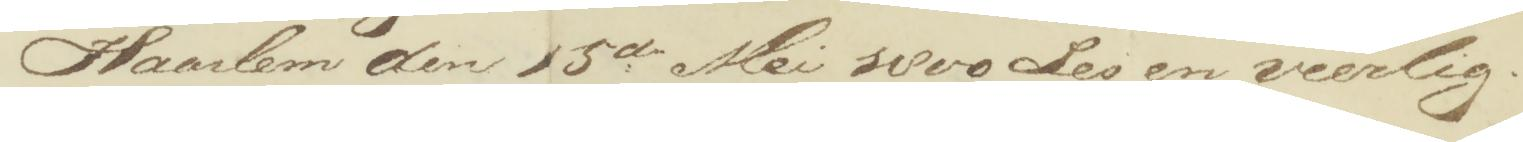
Haarlem den 15:dn Mei 1800 zes en veertig
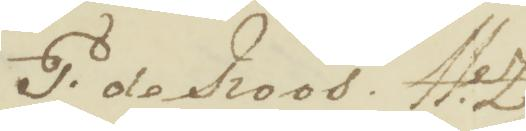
P: de Roos. H:e Z
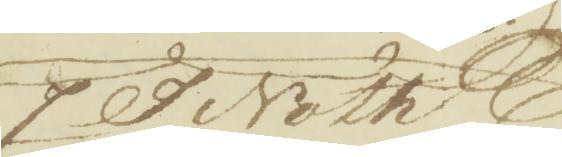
J I Noth
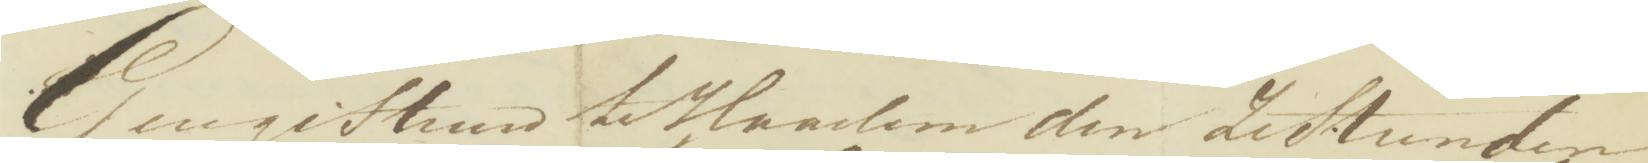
Geregistreerd teHaarlem den Zestienden
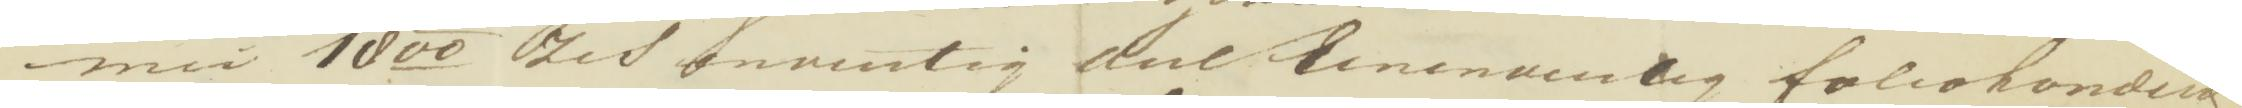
mei 1800 Zes enveertig deel Eenendertig foliohonderd
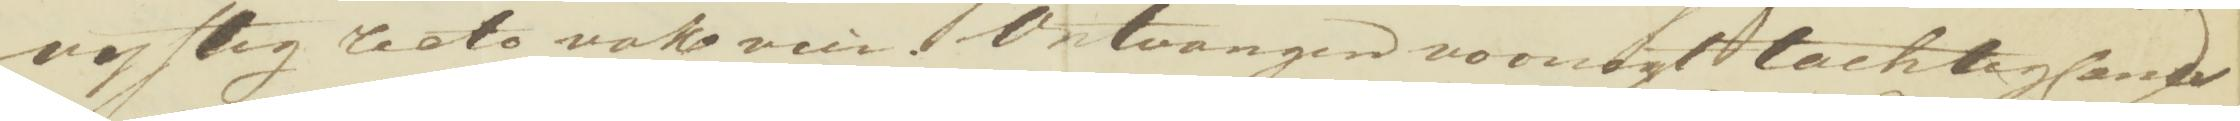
vyftig recto vak vier Ontvangen voorregt tachtig Cents
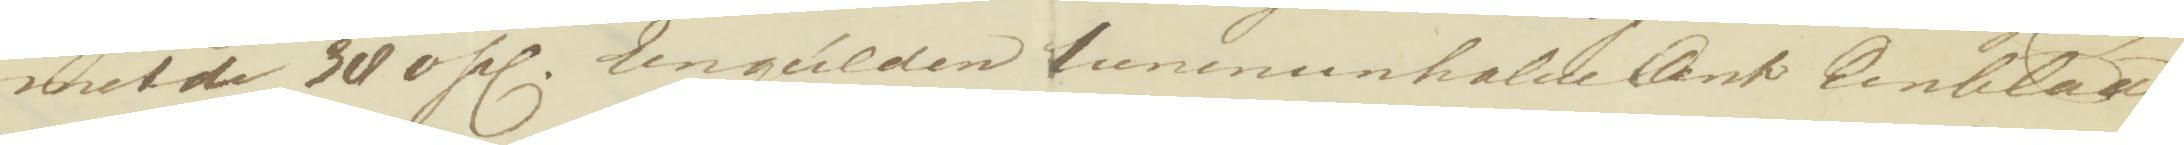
met de 38 opC. Een gulden tieneneenhalve Cent Eenblad
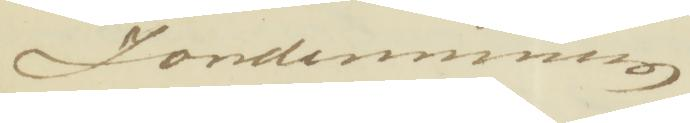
Zonderrenvooy
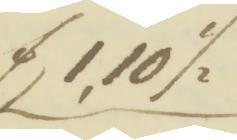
f 1,10½.
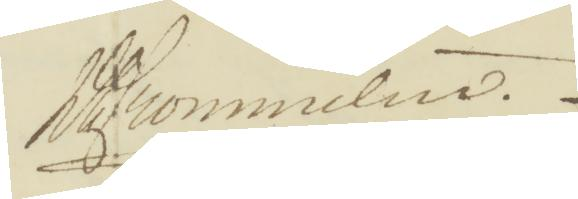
DF:Crommelin.
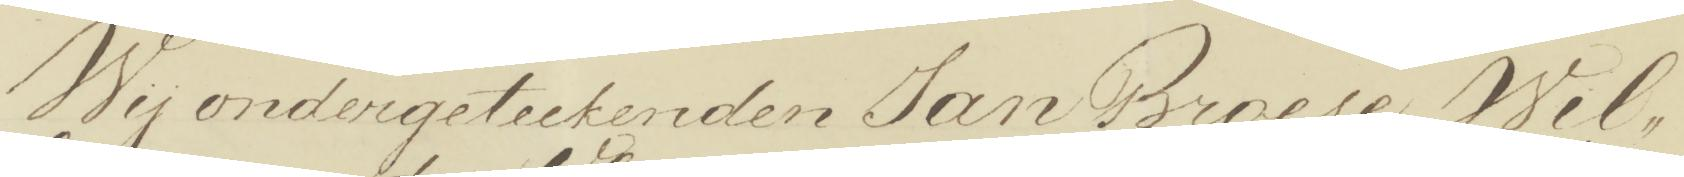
Wij ondergeteekenden Ian Broese, Wil„
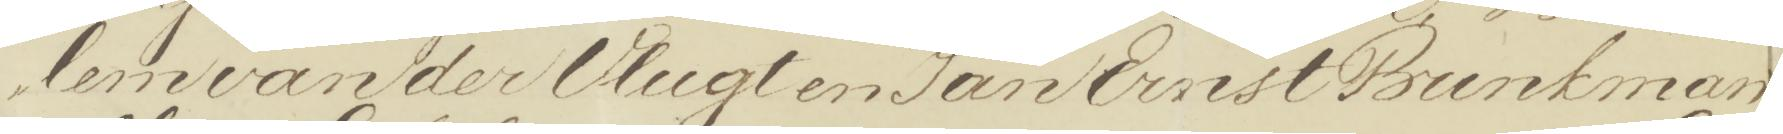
„lem van der Vlugt en Jan Ernst Brinkman,
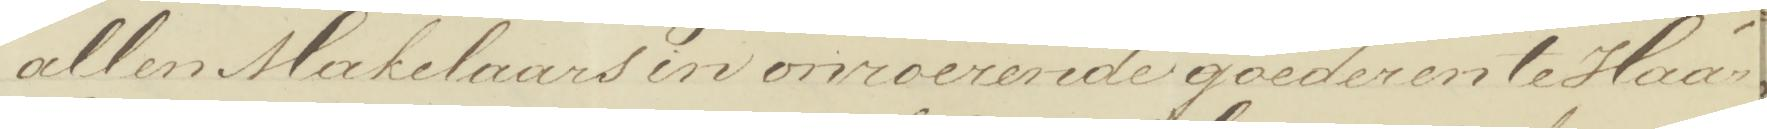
allen Makelaars in onroerende goederen te Haar
